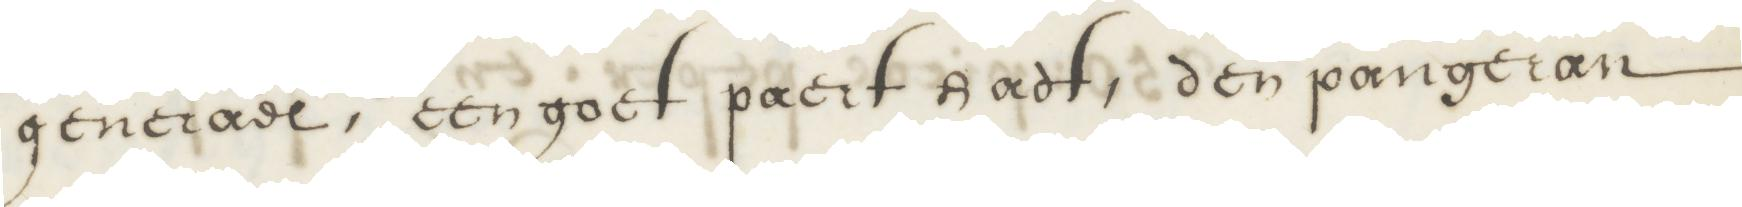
generael, een goet paert hadt, den pangeran
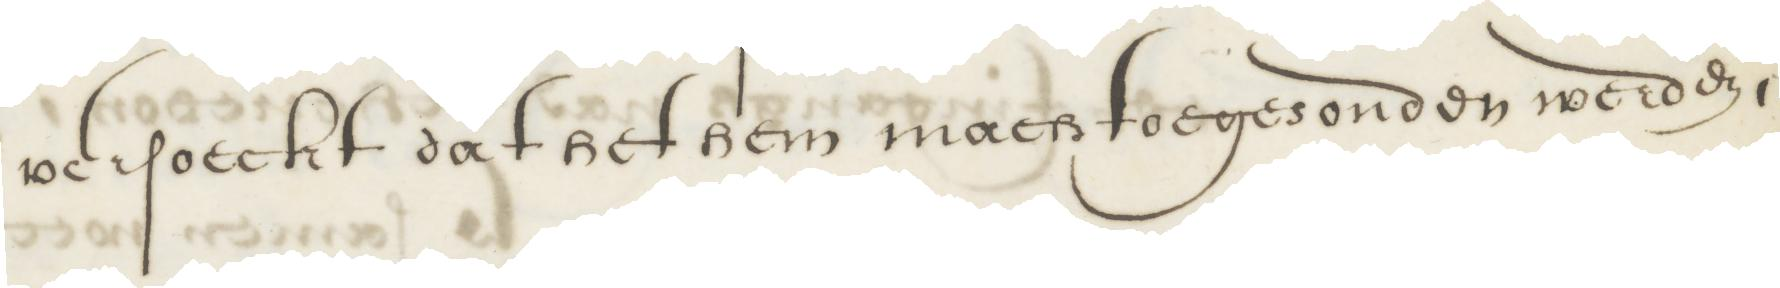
versoeckt dat het hem mach toegesonden werden,
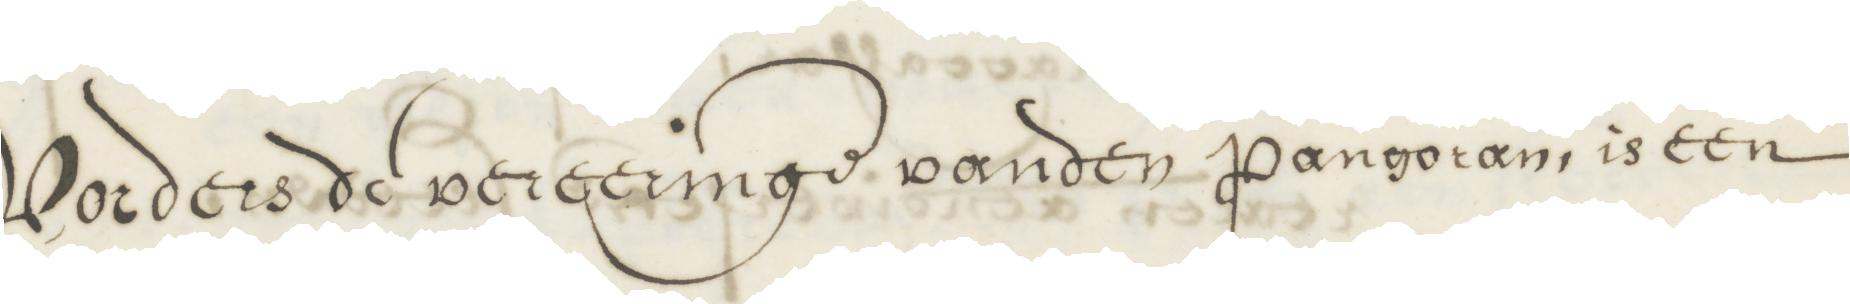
Vorders de vereeringe van den pangoran, is een
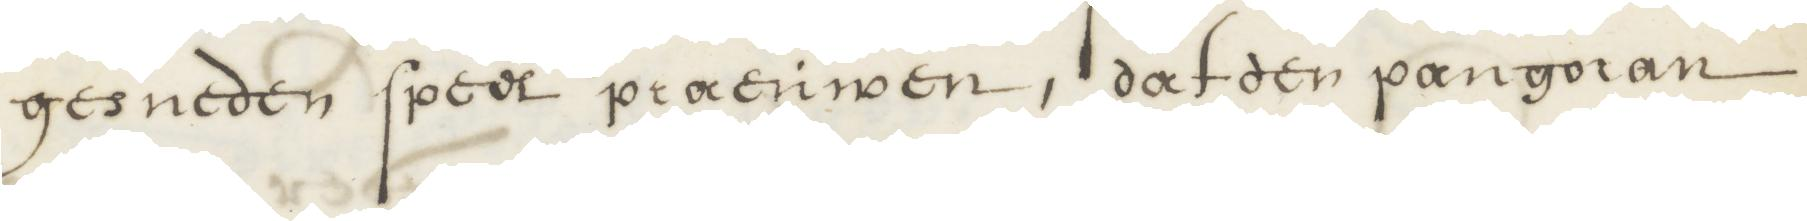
gesneden speel praeuwen, dat den pangoran
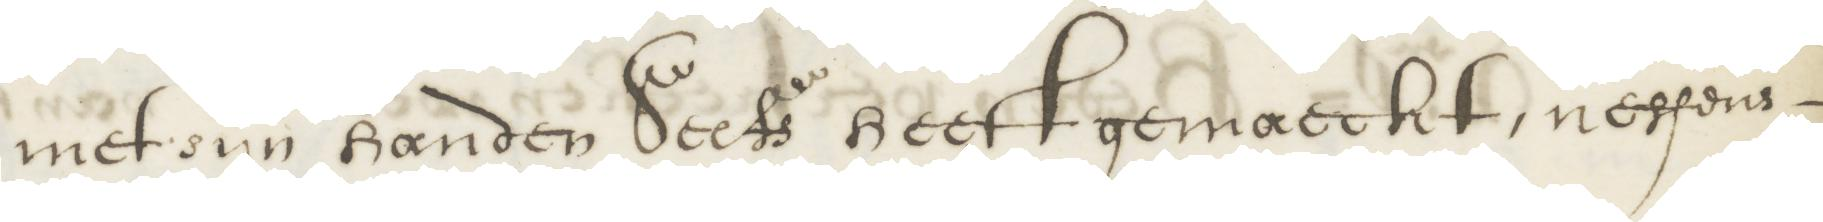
met sijn handen selfs heeft gemaeckt, neffens
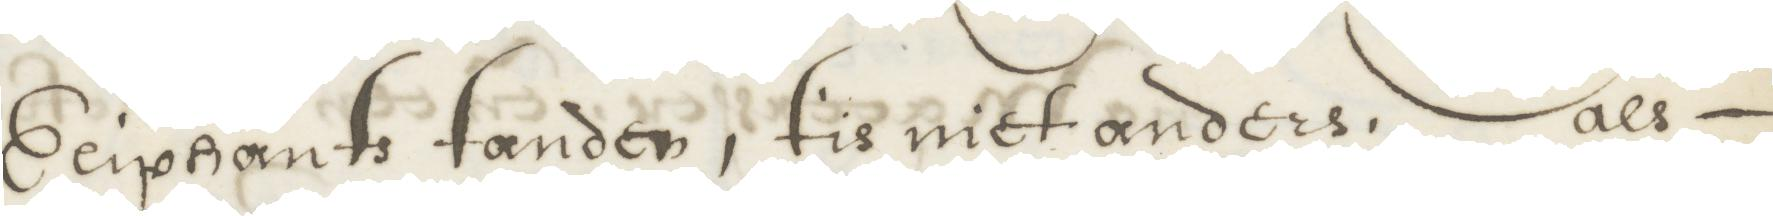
Eliphants tanden, t'is niet anders, als
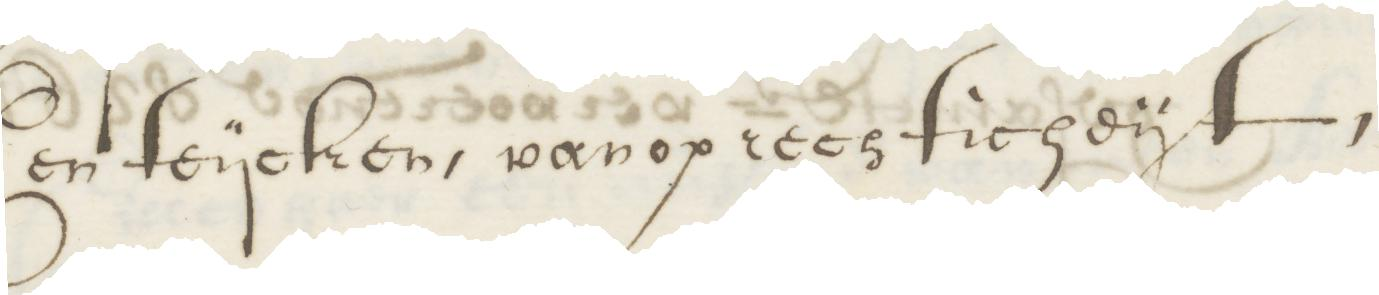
Een teijcken, van op rechticheijt,
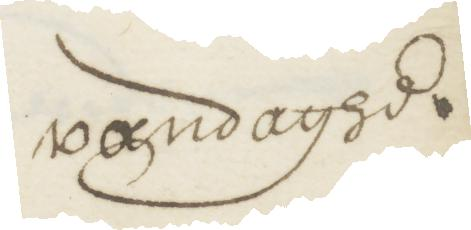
vandaghe.
